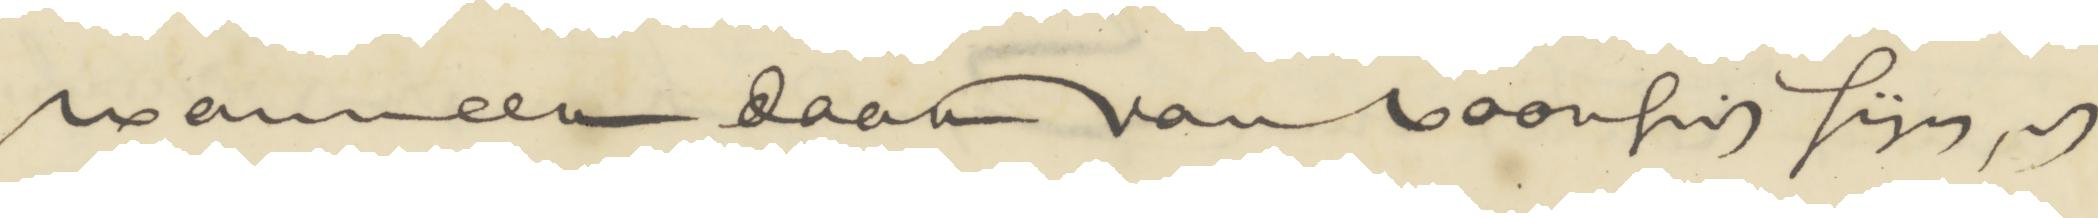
wanneer daar van voorsien sijn, en
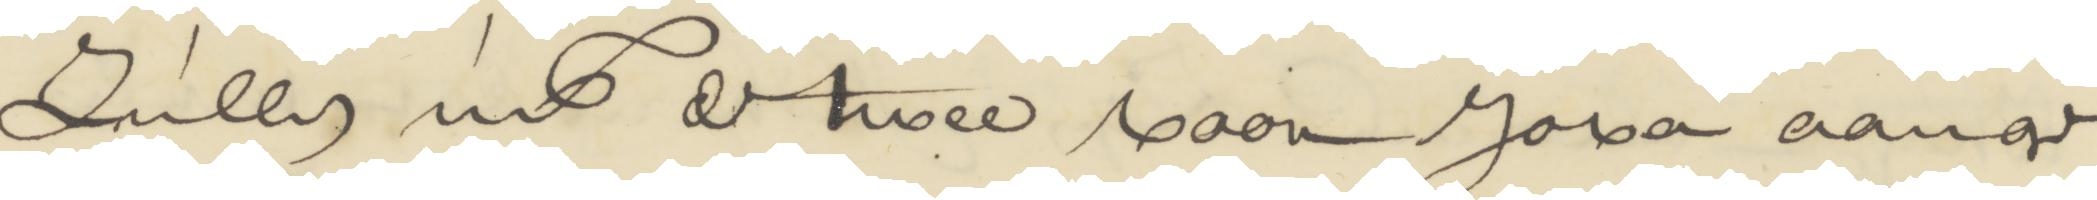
Zullen uE de twee voor Java aange
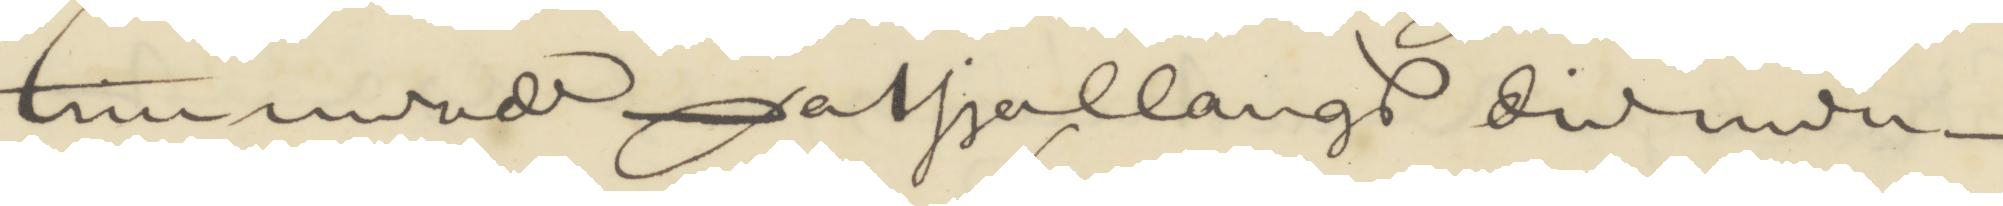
timmerde patsjallangs die men
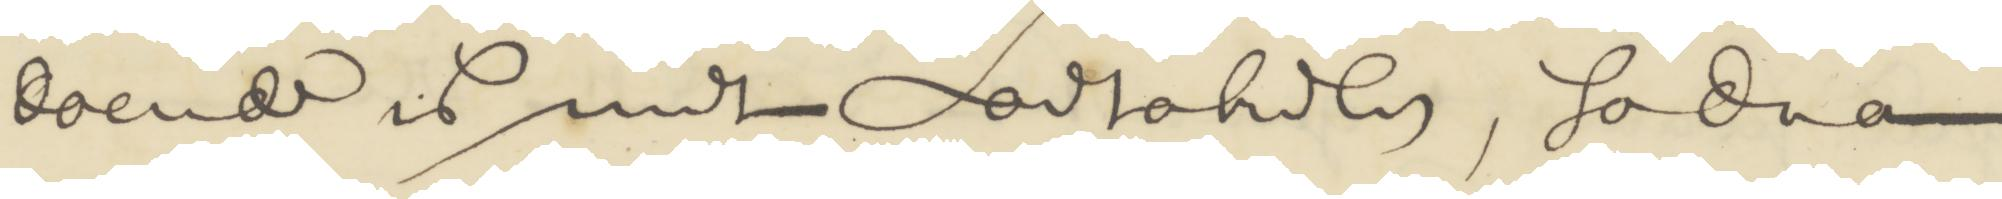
doende is met Toetakelen, So dra
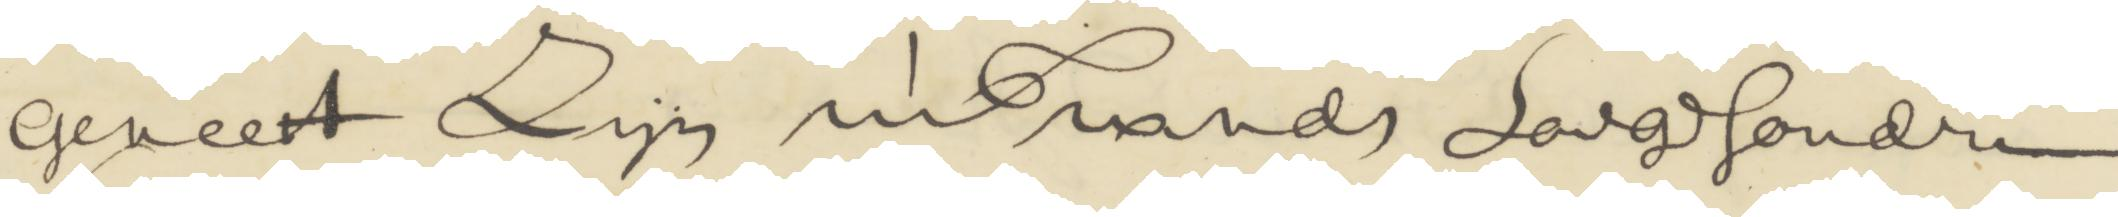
gereett, Zijn uE werden Toegesonden
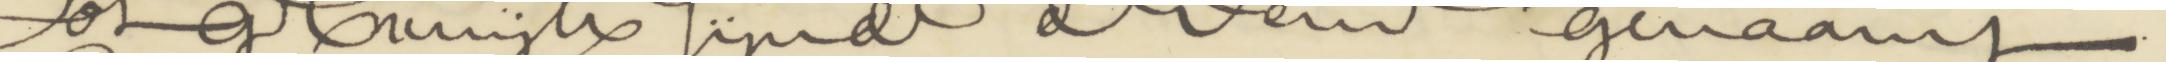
Tot gebruijk sijnde de Eene genaamt
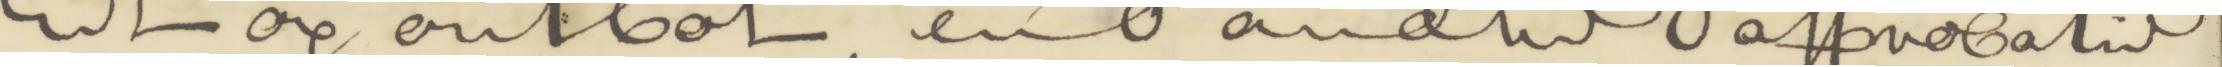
het op ontbot, en d' andere d' approbatie,
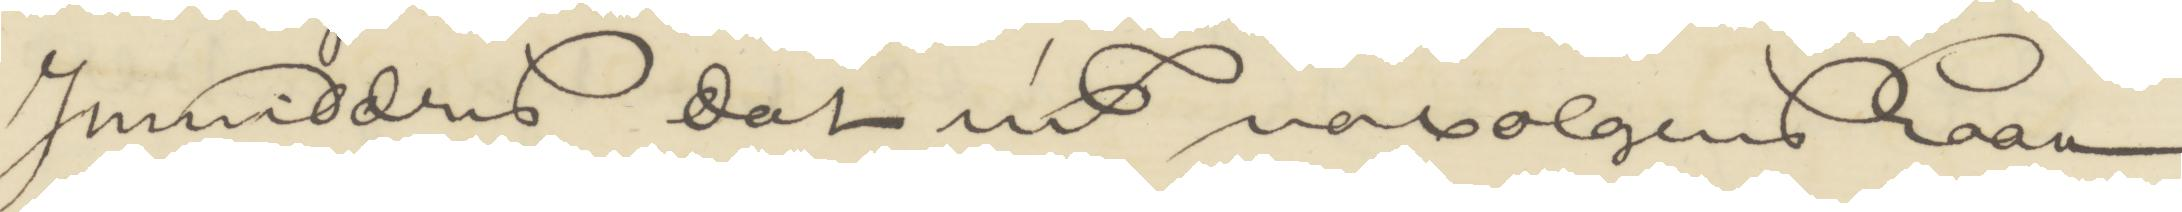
Jnmiddens dat uE navolgens haar
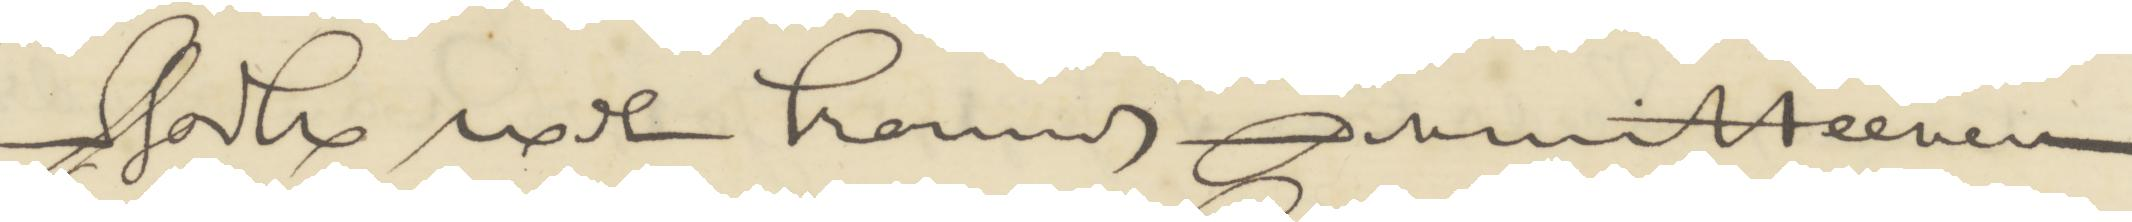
versoek wel konnen permitteeren
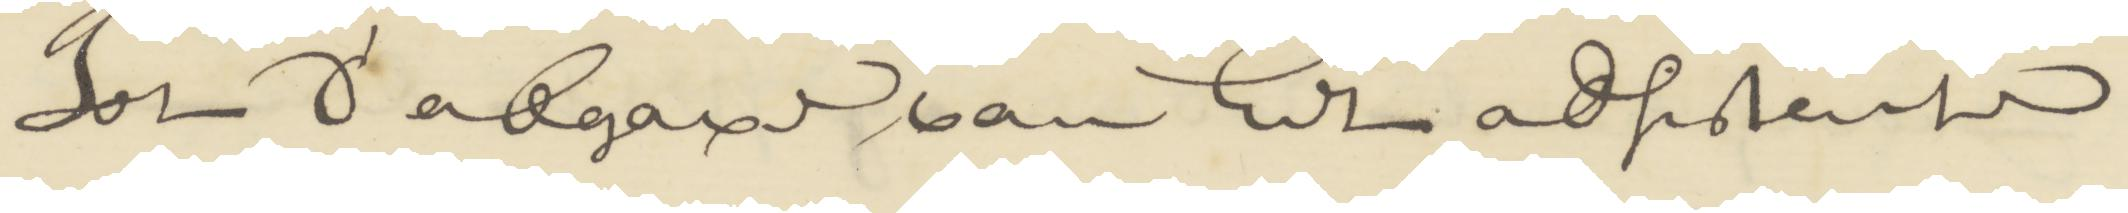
Tot d’ afgave van het adsistente
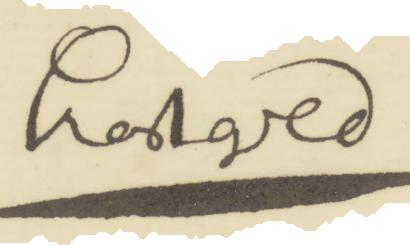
kostgeld
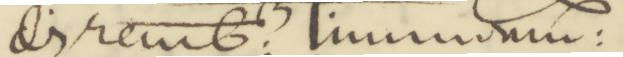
den remb:s Timmerm:
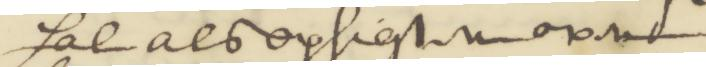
sal als op sigter over
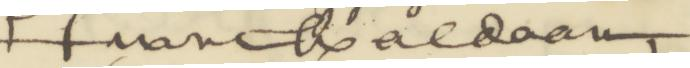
't werck aldaar,
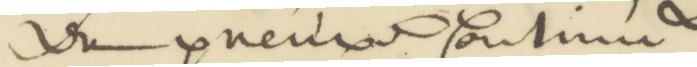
ten preuve continu
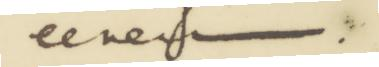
eeren.
